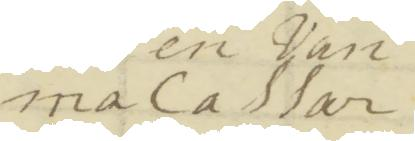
macassar
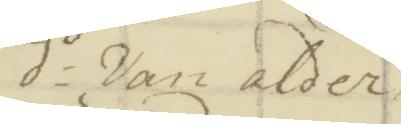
d=o van alder
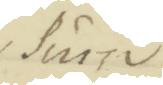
sum
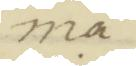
ma
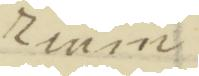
rium
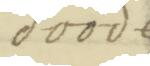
doode
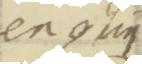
en quij
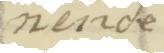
nende
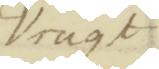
Vrugt
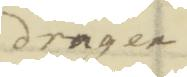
dragen
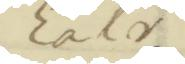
halv
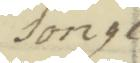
Jonge
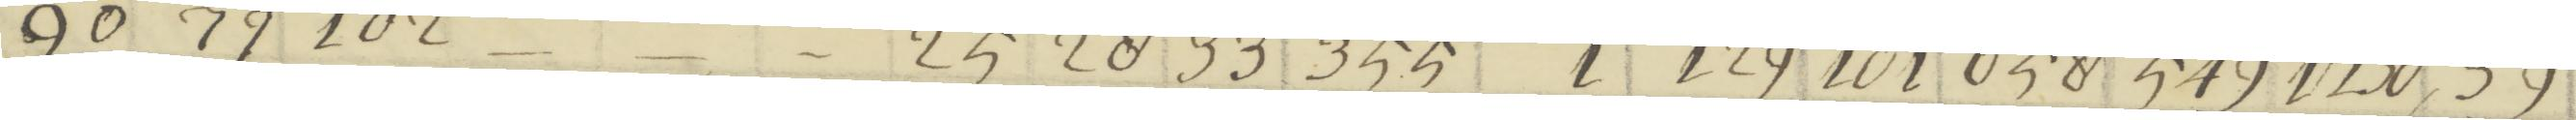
90 79 102 — — — 25 28 33 355 1 129 101 658 549 1230, 39
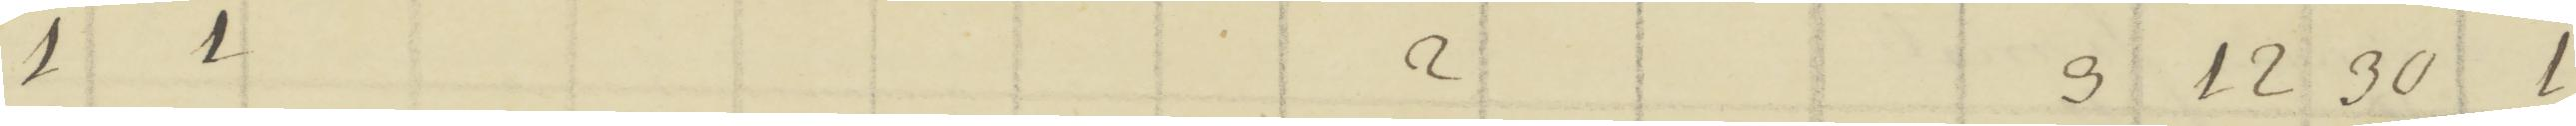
1 1 2 3 12 30 1
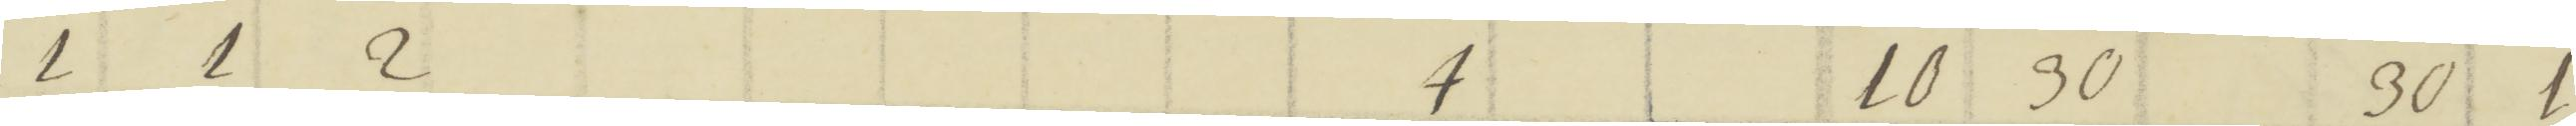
1 1 2 4 10 30 30 1
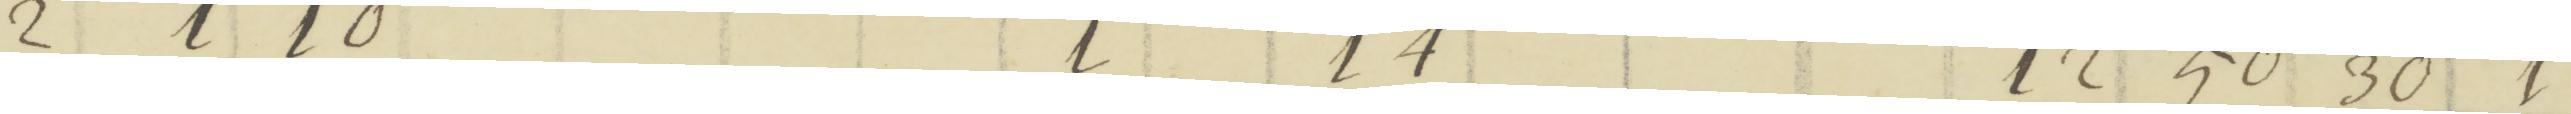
2 1 10 1 14 12 50 50 30 1
